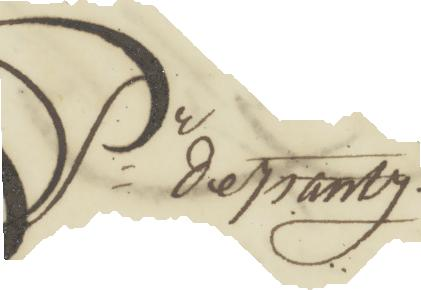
P=r de panter:
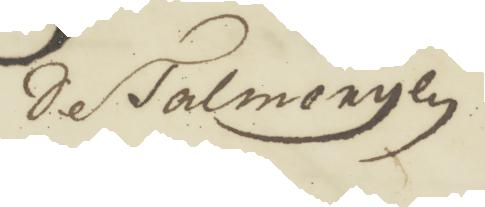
de Talmerijen
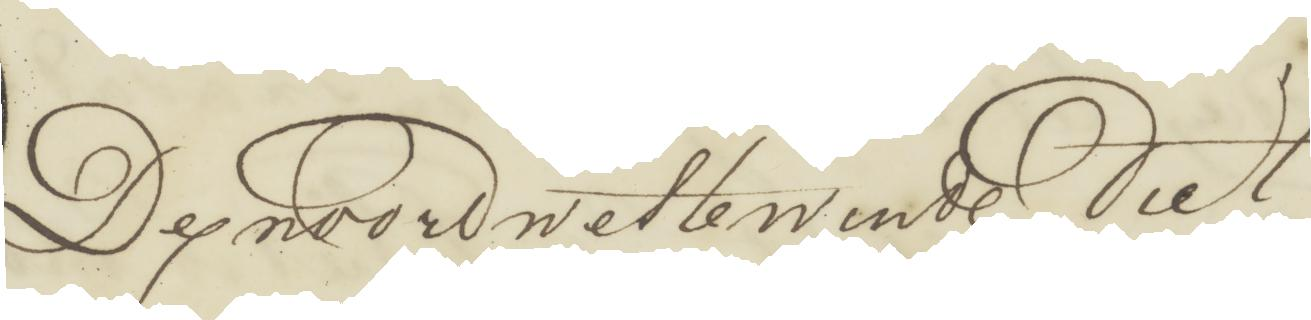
De noord westen winde, die 't
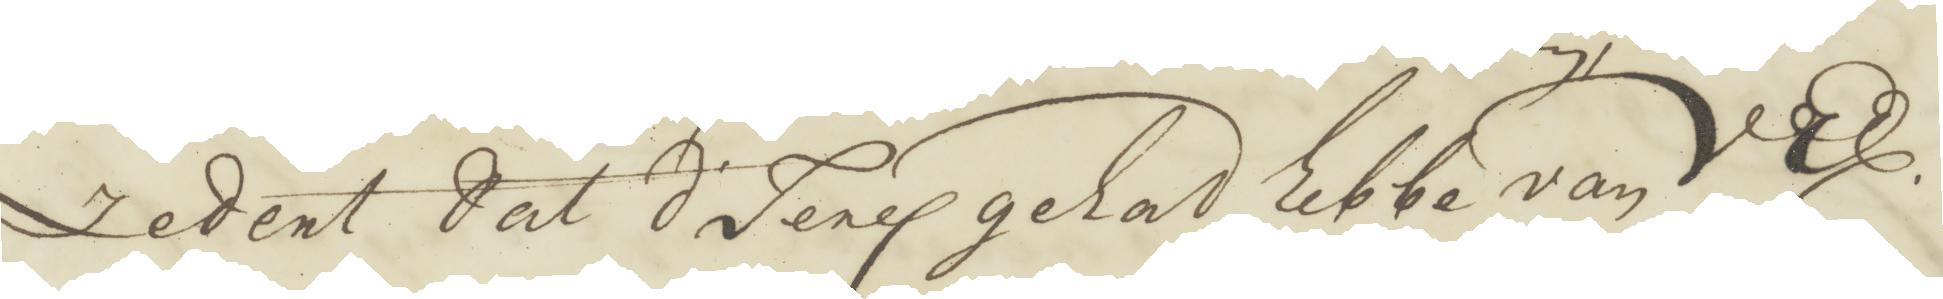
zedert dat d’Eere gehad hebbe van UE.
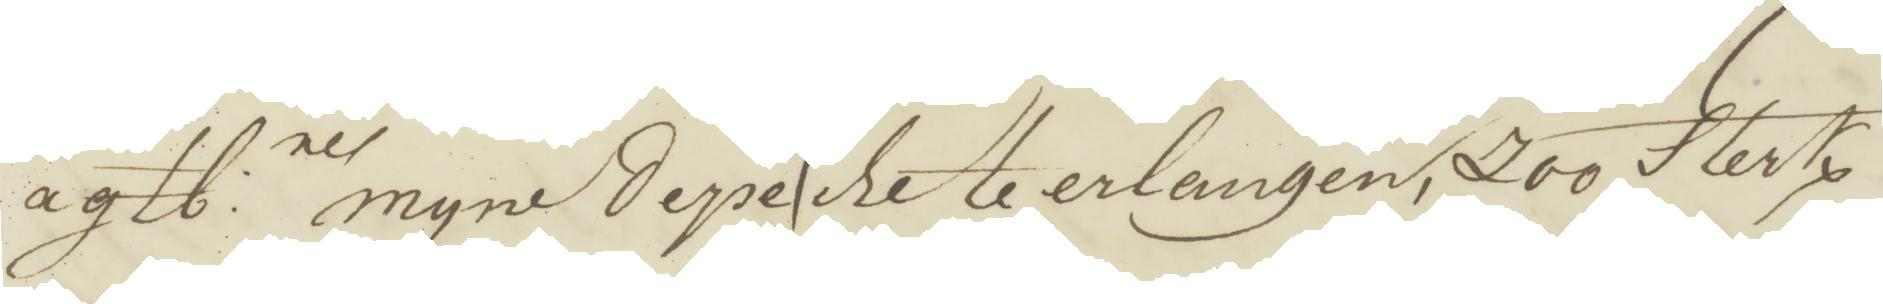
agtb:re mijne depeche te erlangen, zoo sterk
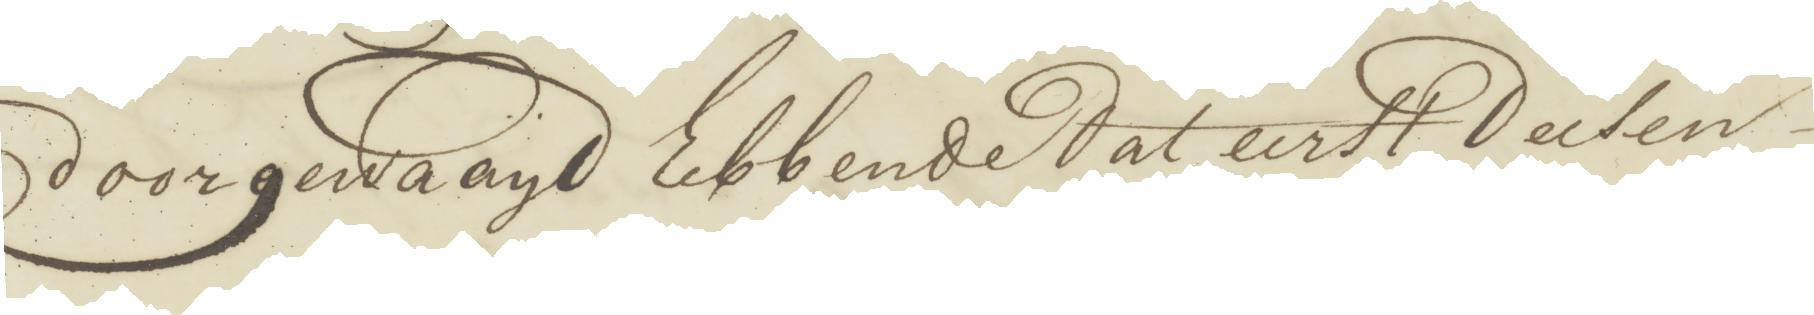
door gewaaijd hebbende dat eerst deesen
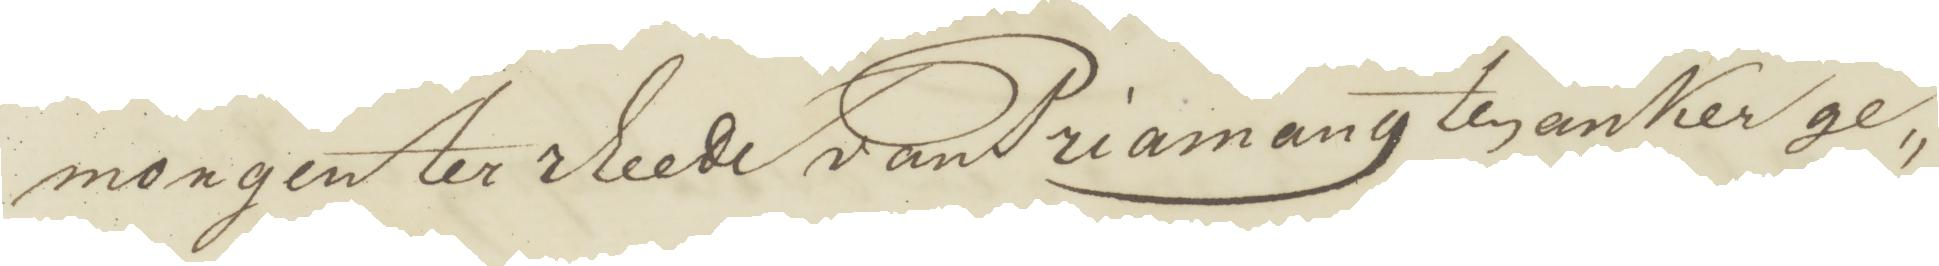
morgen ter rheede van Priamang ten anker ge„
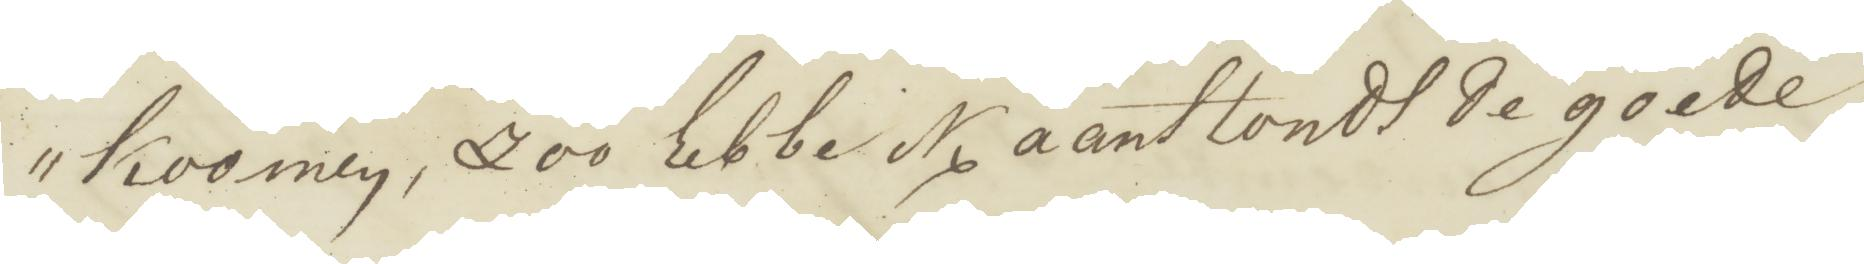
„koomen, zoo hebbe ik aanstonds de goede
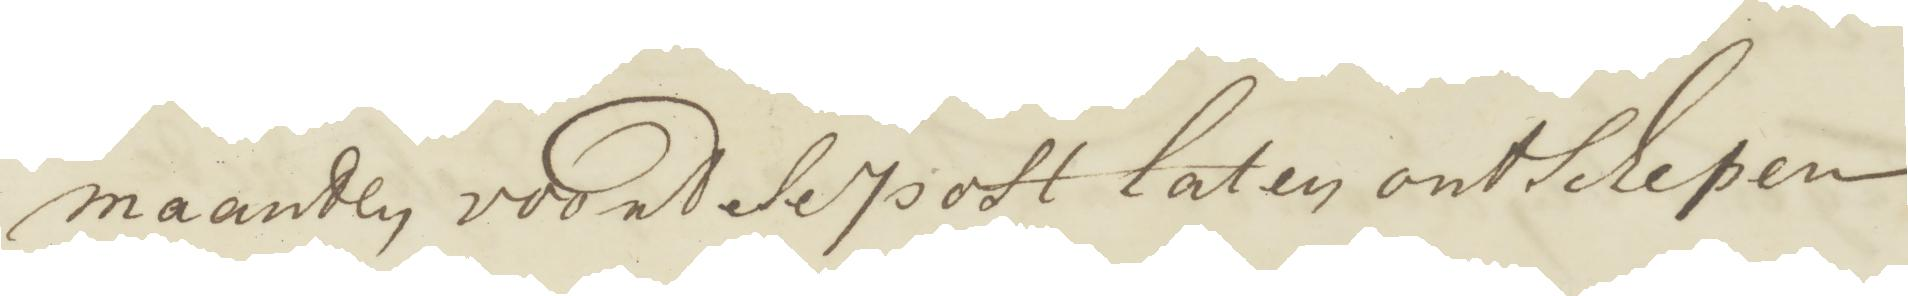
maanden voor dese post laten ontschepen
